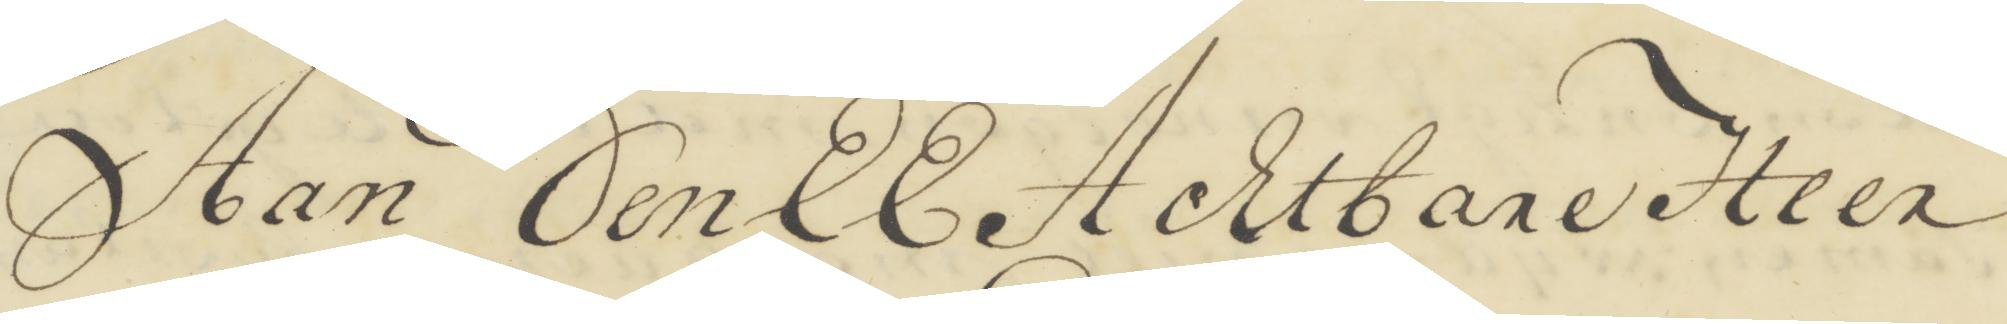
Aan Den EE Achtbare Heer
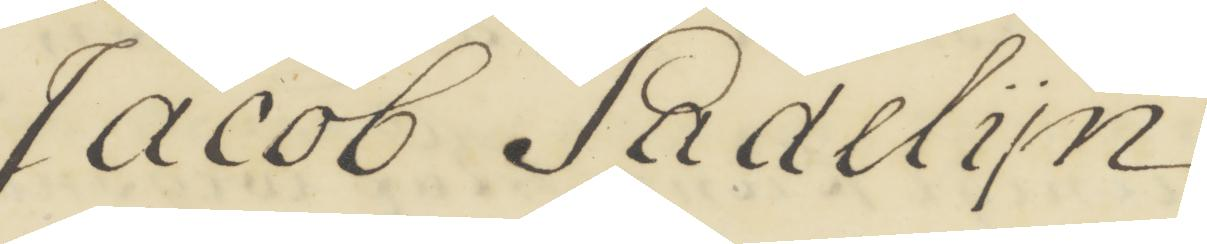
Jacob Sadelijn
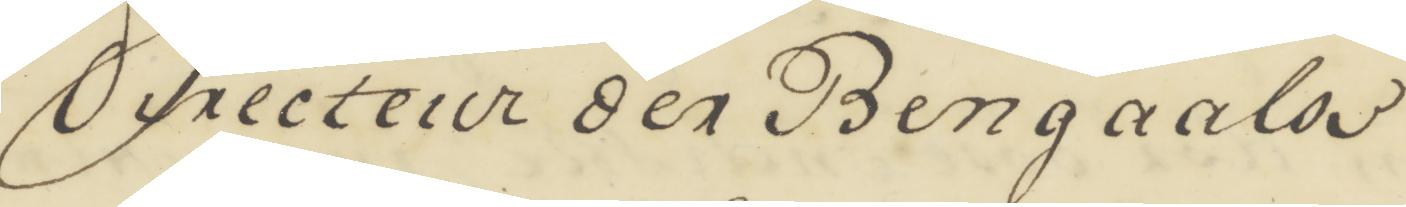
Directeur der Bengaalse
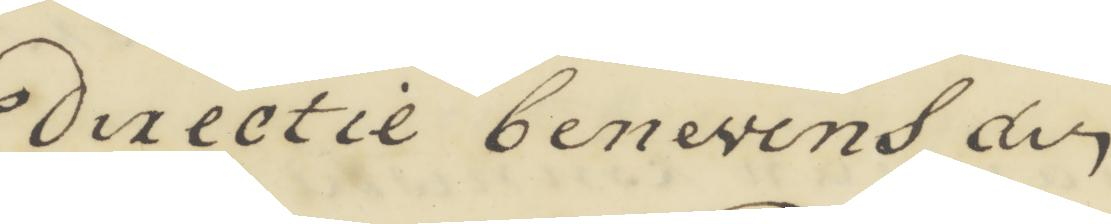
directie benevens den
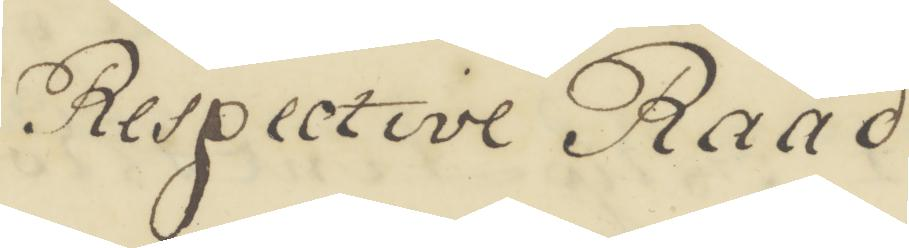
Respective Raad
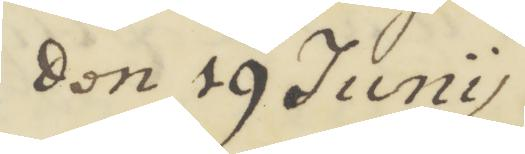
den 19 Iunij
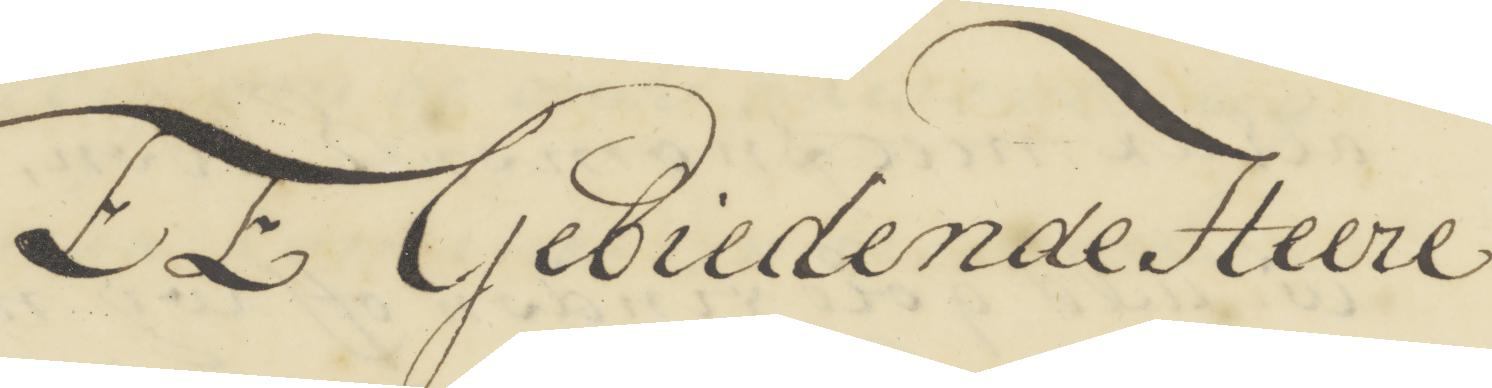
EE Gebiedende Heere
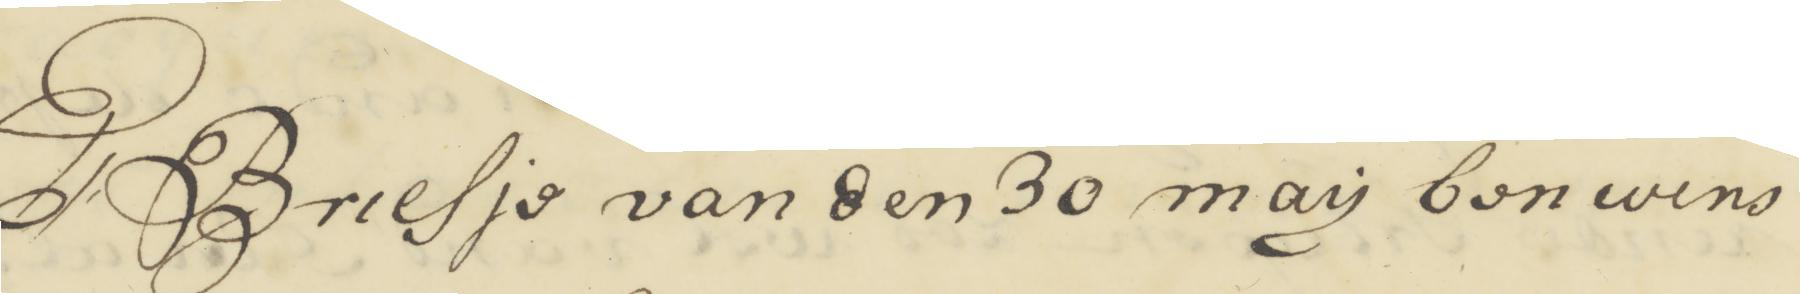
V E Briefje van den 30 maij benevens
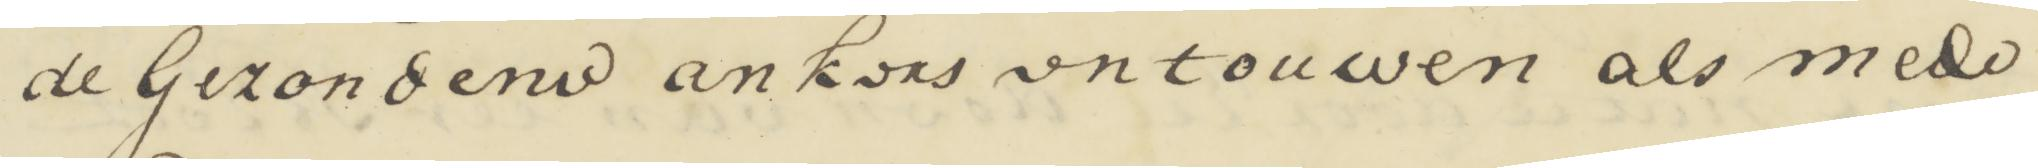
de Gezondene ankers en touwen als mede
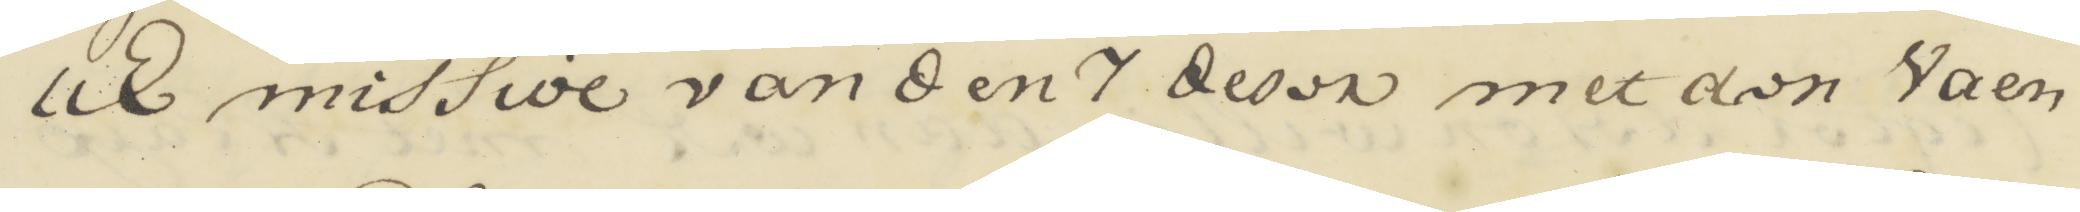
uE missive van den den 7 deser met den Vaen
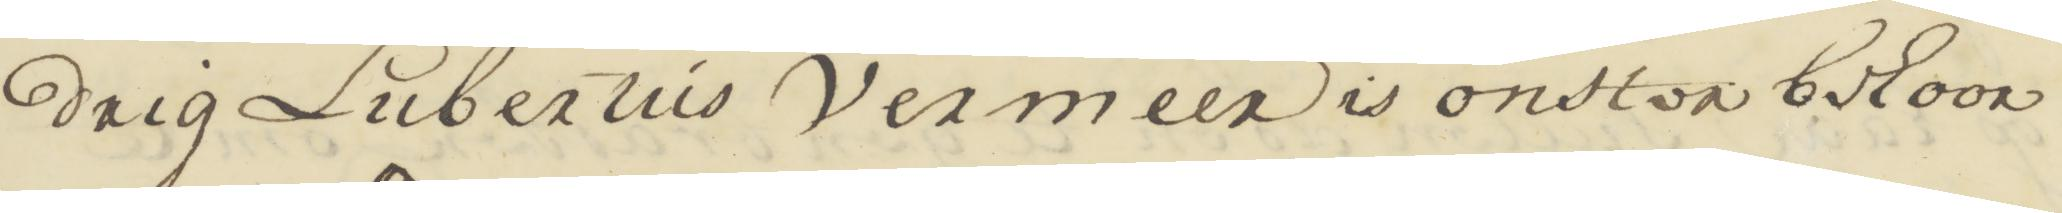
drig Lubertus Vermeer is ons ter behoor
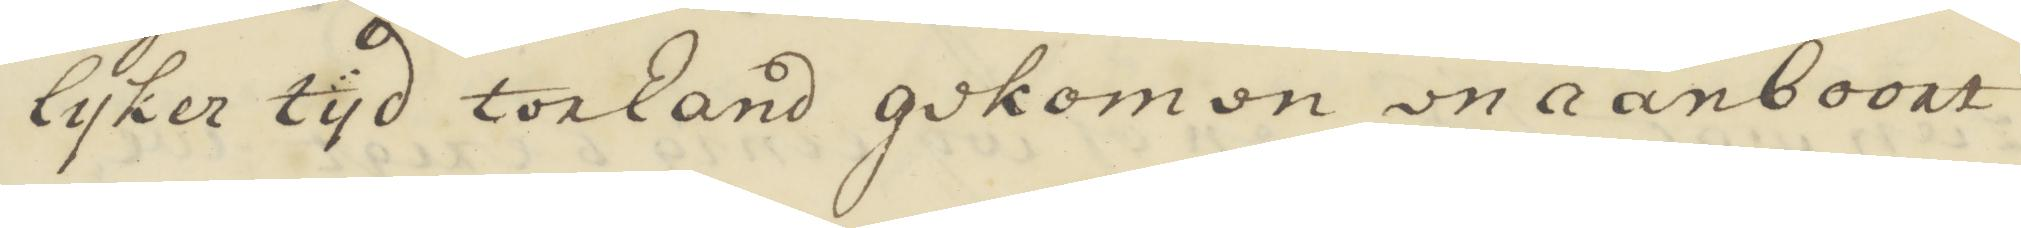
lyker tijd ter hand gekomen en aan boort
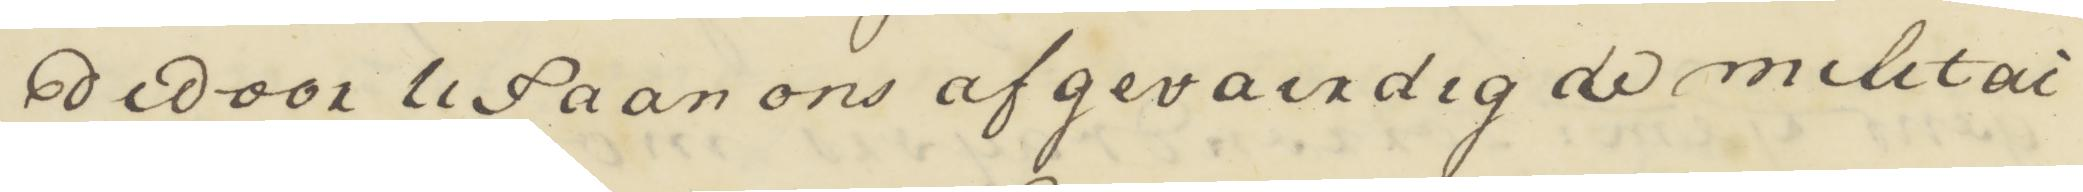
de door UE aan ons afgevaerdig de militai
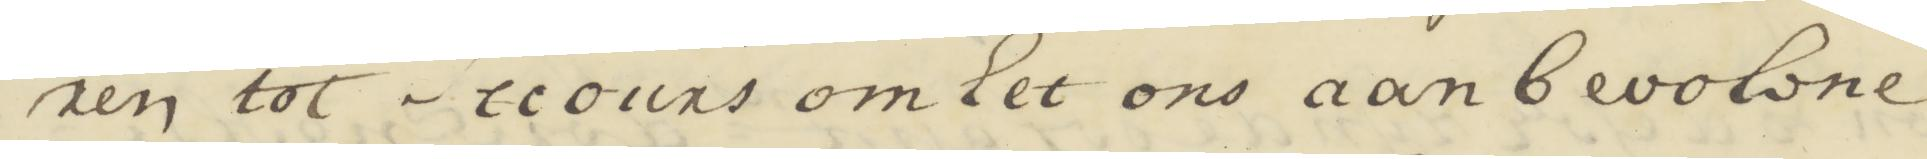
ren tot Secours om het ons aan bevolene
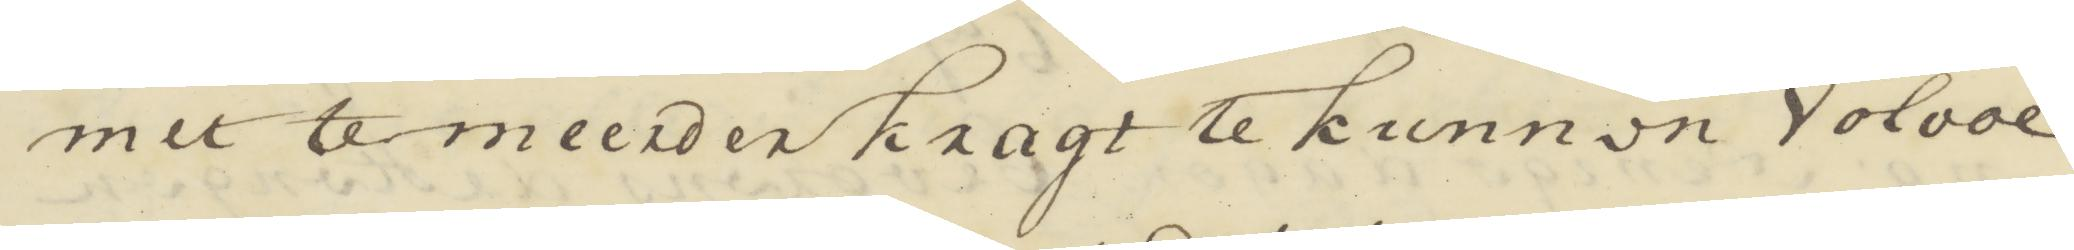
met te meerder kragt te kunnen Volvoe
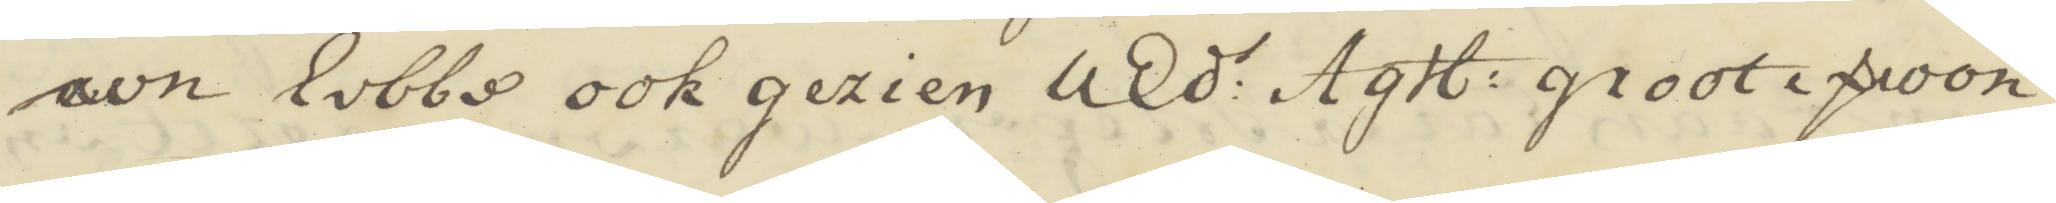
ren hebbe ook gezien uEd:s Agtb: groote verwon
